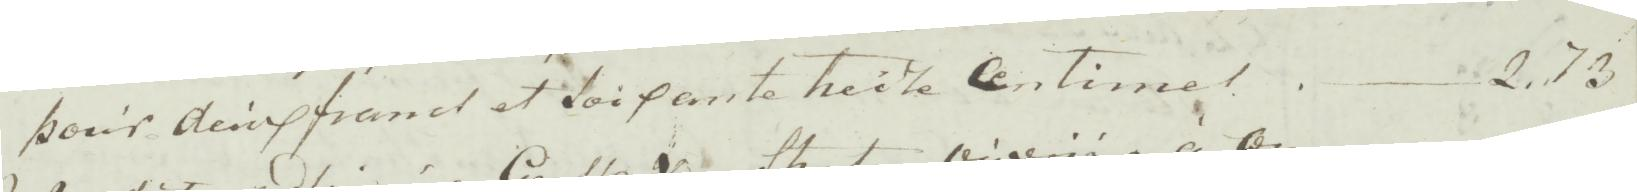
pour deux francs et Soixante treize Centimes — 2„73
